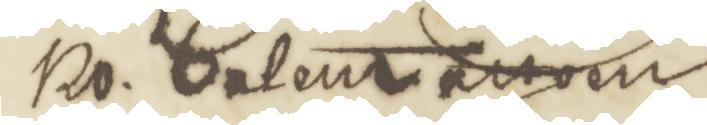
120. balenCattoen
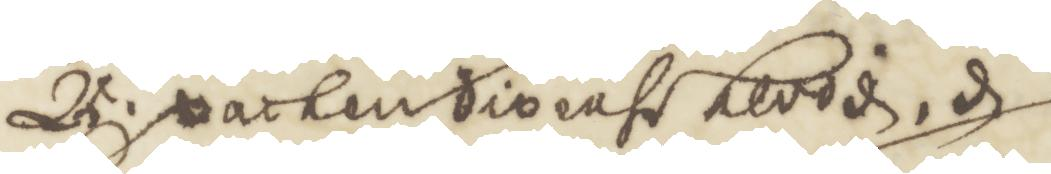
25. packen diverse kleden, en
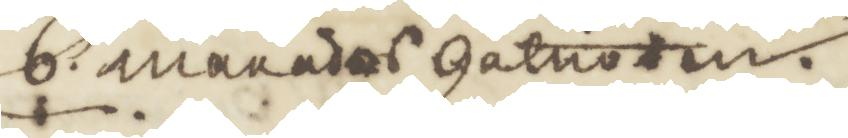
6. marados galnoten.
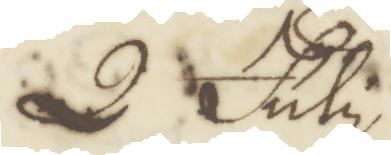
2 Julij
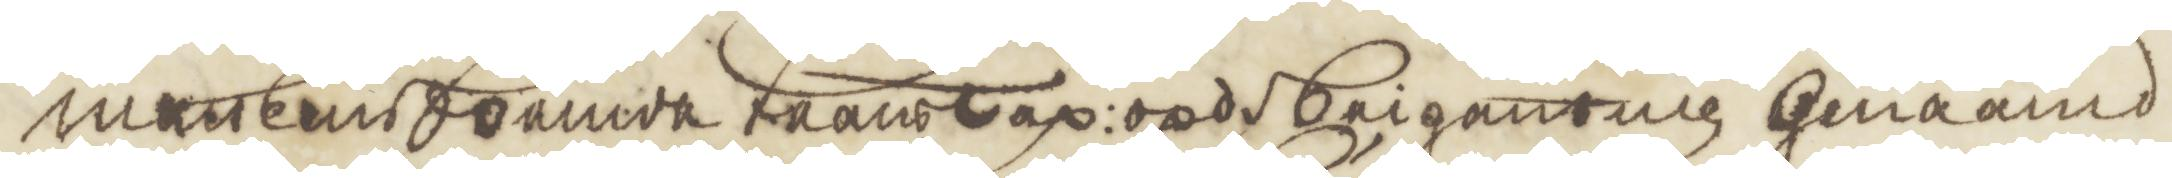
matthius former Frans Cap': op de brigantine genaamd
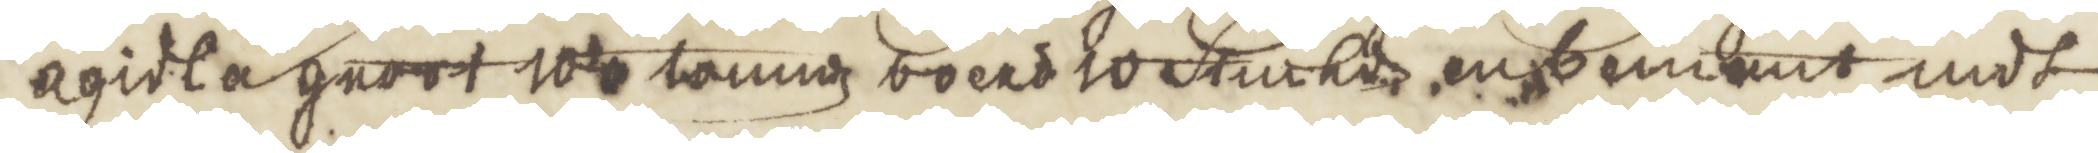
agiela groot 100 tonnen voerd 10 stucken en bemant met
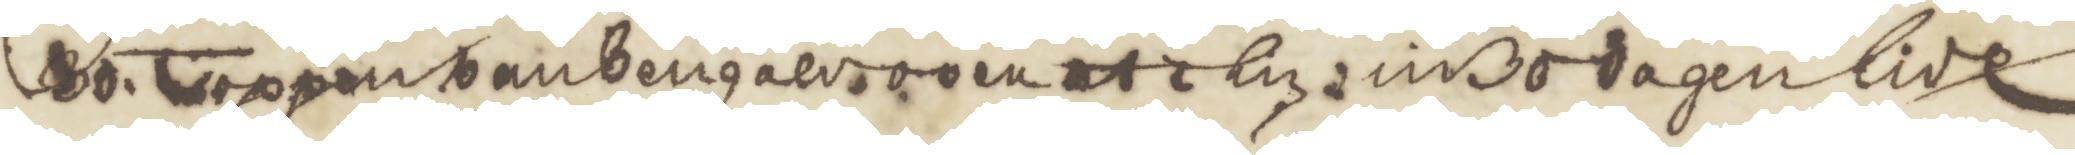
30. Coppen van bengale over atchin: in 30 dagen hier
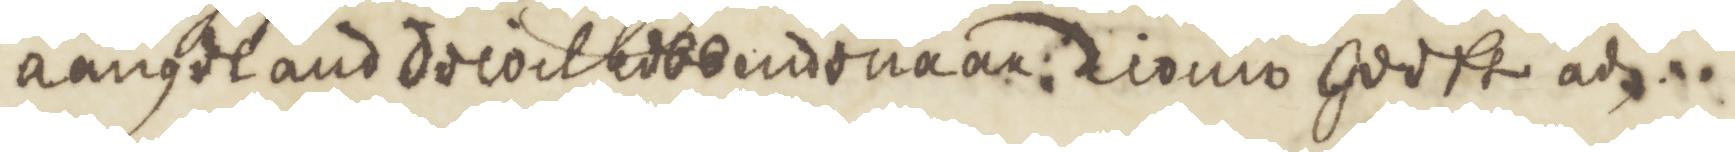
aangeland dewil hebbende naar: riouw geeft aen.
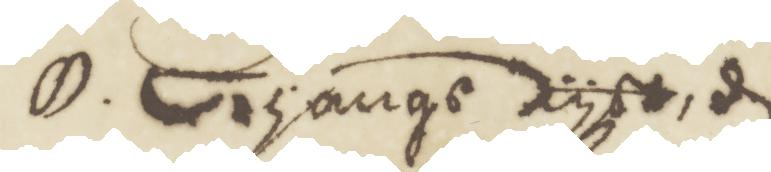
8. Coyangs rijst, en
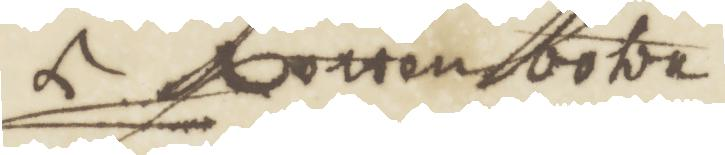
5 potten boter
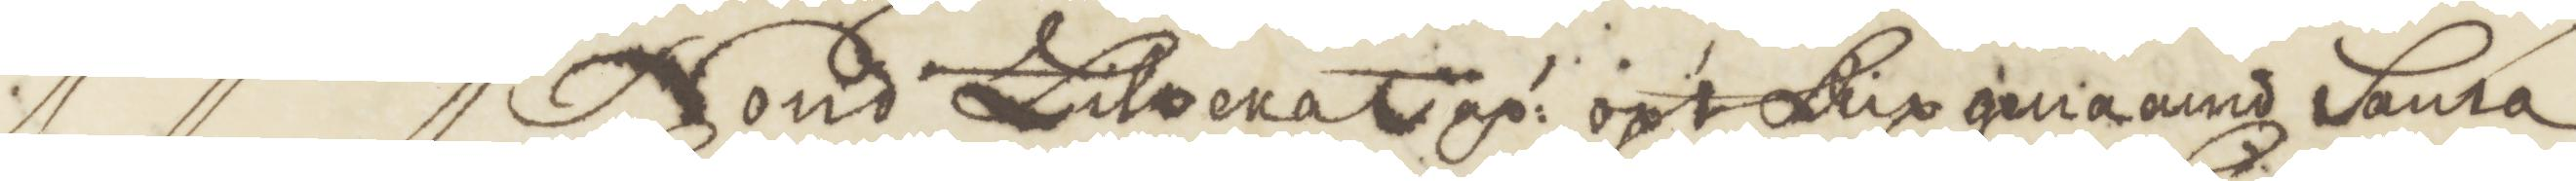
„ „ „ Noud Zilvera Cap:' op ’t schip genaamd Santa
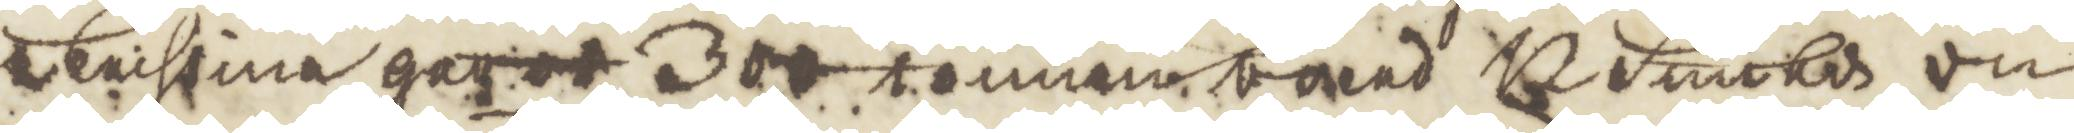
Christina groot 300 tonnen voerd 12 Stucken en
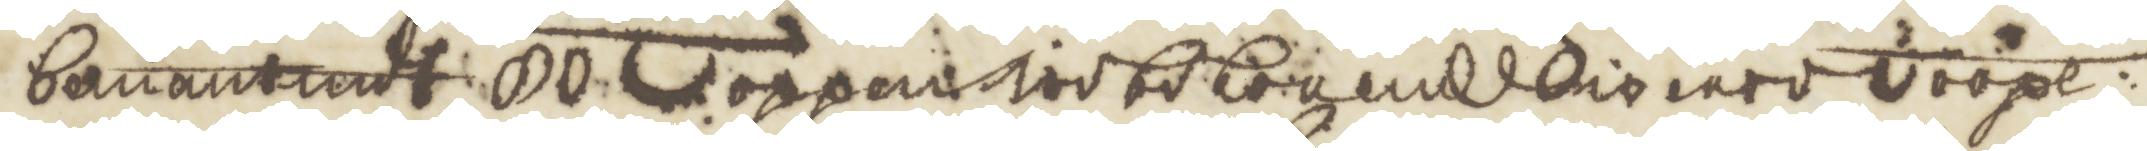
bemantmet 80 Coppen toe behorende diverse Coopl:
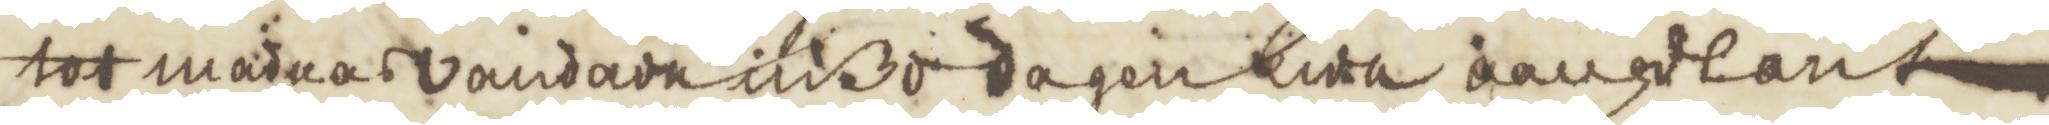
tot madras vandaer in 30 dagen hier aangelant
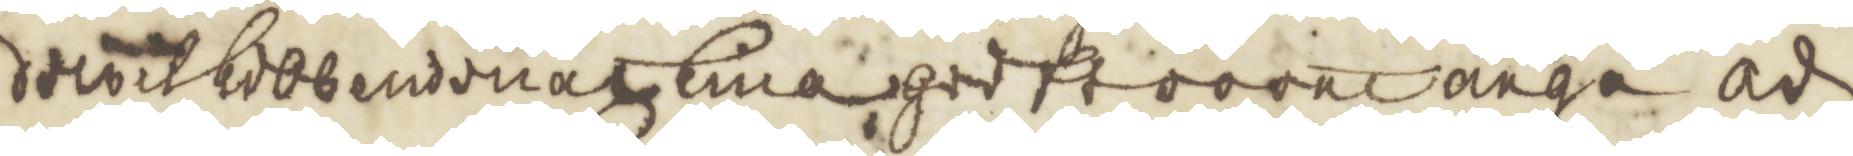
dewil hebbende na China geeft voorcarga aen
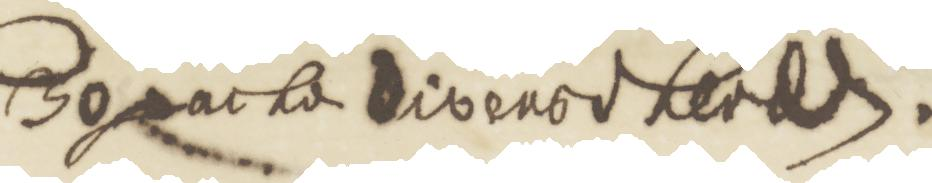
30 packen diverse kleden.
